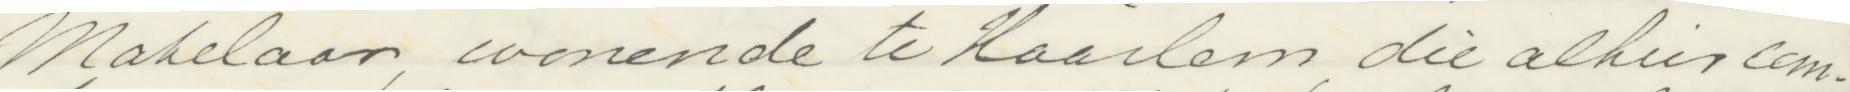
Makelaar, wonende te Haarlem die alhier com-
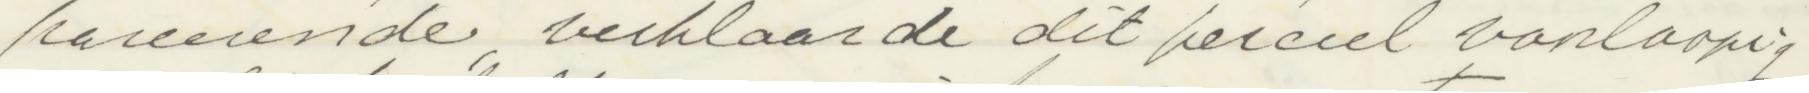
pareerende, verklaarde dit perceel voorloopig
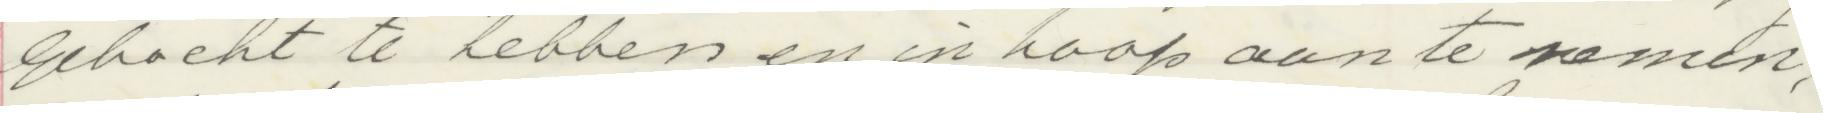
gekocht te hebben en in koop aan te nemen,
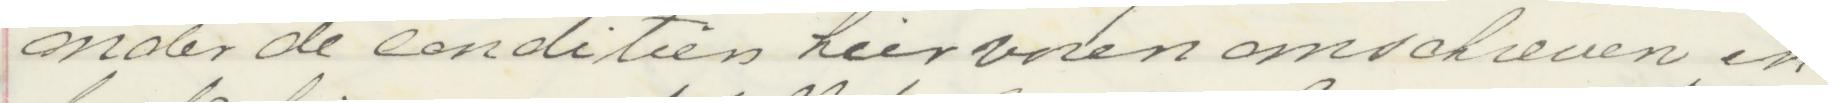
onder de conditiën hier voren omschreven en
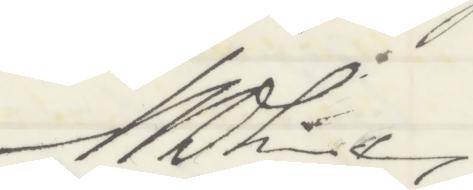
AVDLinden
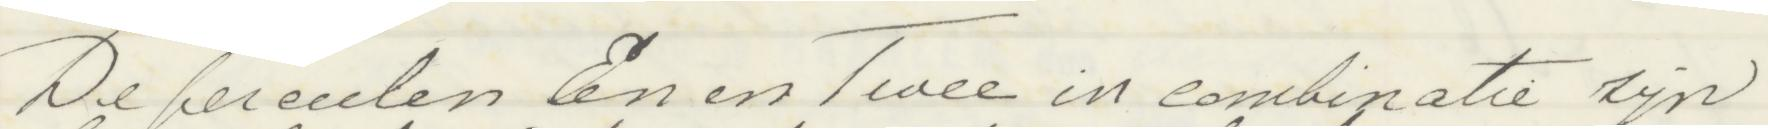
De perceelen Een en twee in combinatie zijn
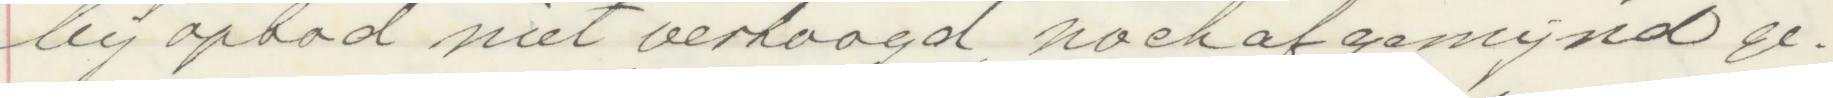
bij opbod niet verhoogd, noch afgemijnd ge„
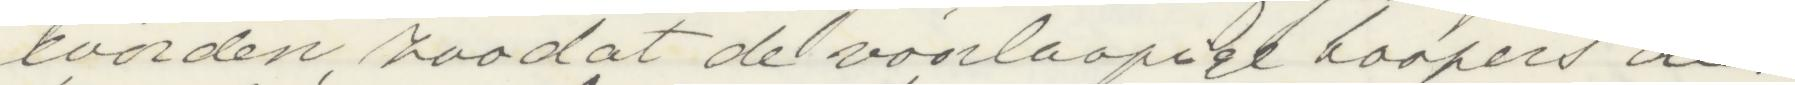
worden, zoodat de voorloopige koopers dees
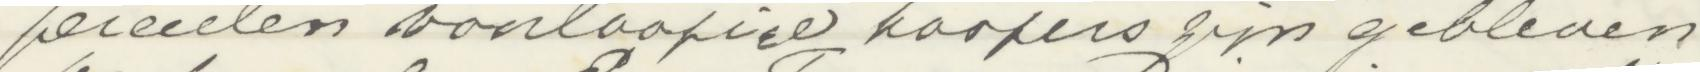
perceelen voorloopige koopers zijn gebleven
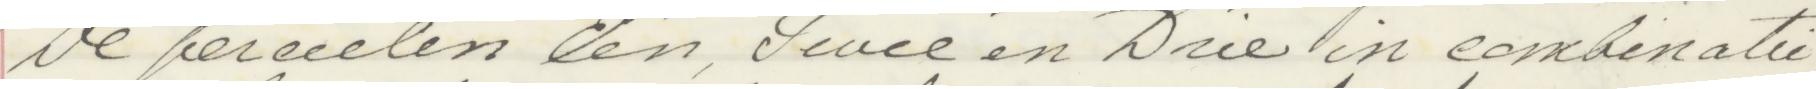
De perceelen Een, Twee en Drie in combinatie
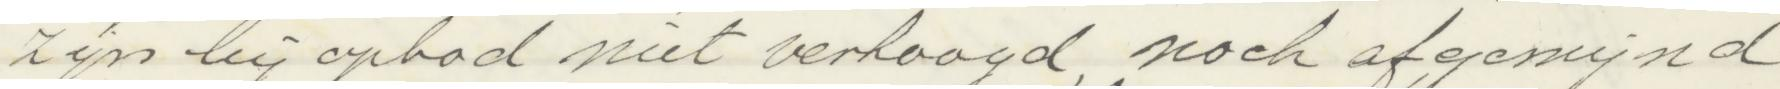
zijn bij opbod niet verhoogd, noch afgemijnd
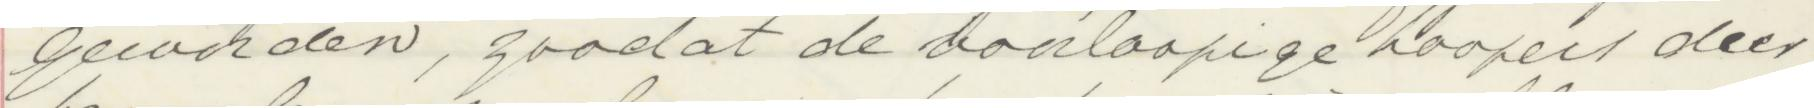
geworden, zoodat de voorloopige koopers dees
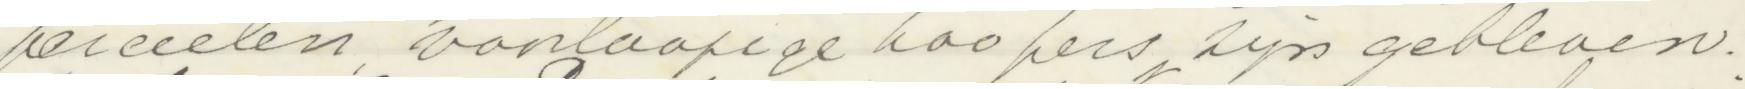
perceelen voorloopige koopers zijn gebleven.
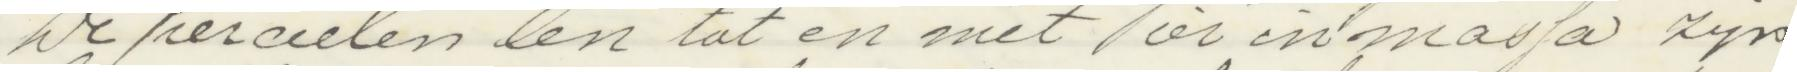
De perceelen Een tot en met Vier in massa zijn
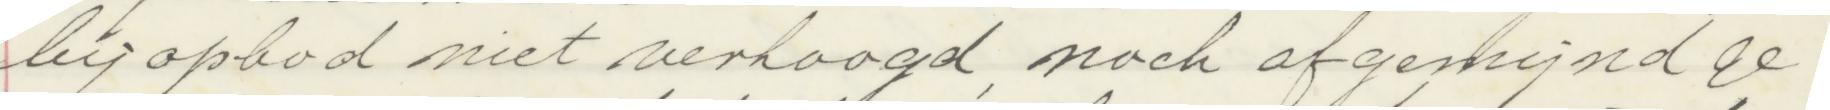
bij opbod niet verhoogd noch afgemijnd ge-
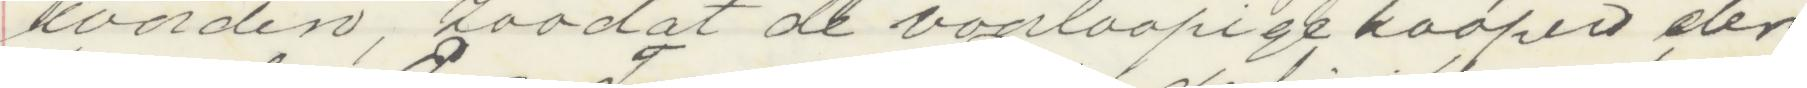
worden, zoodat de voorloopige koopers der
